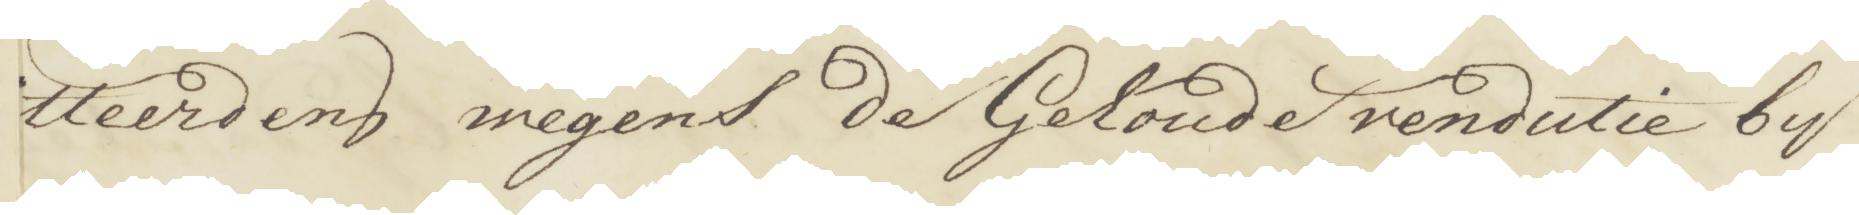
tteerdend wegens de Gehoude vendutie by
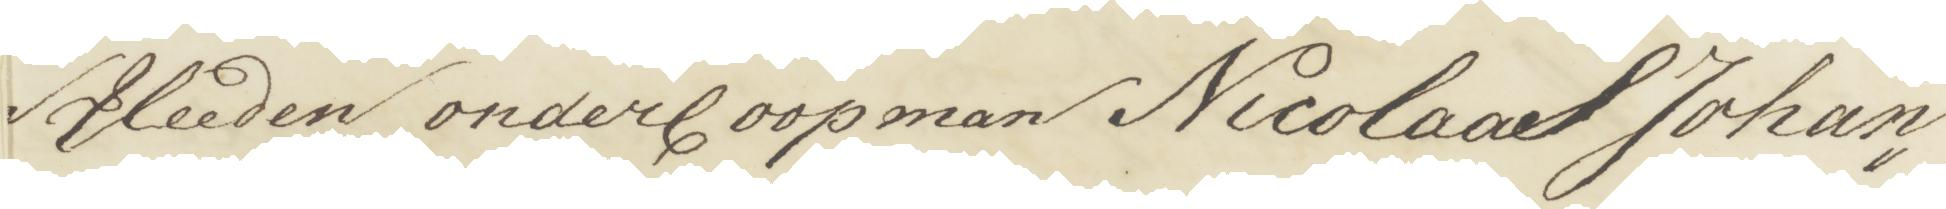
verleeden ondercoopman Nicolaas Johan„
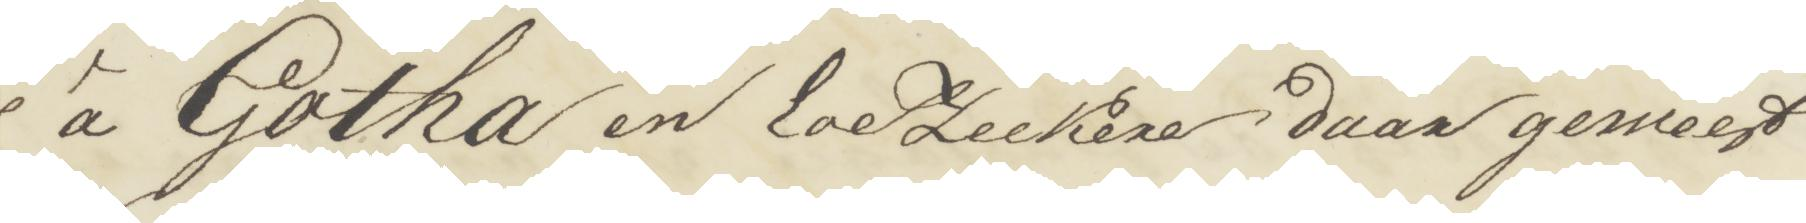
â Gotha en hoe Zeekere, daar geweest
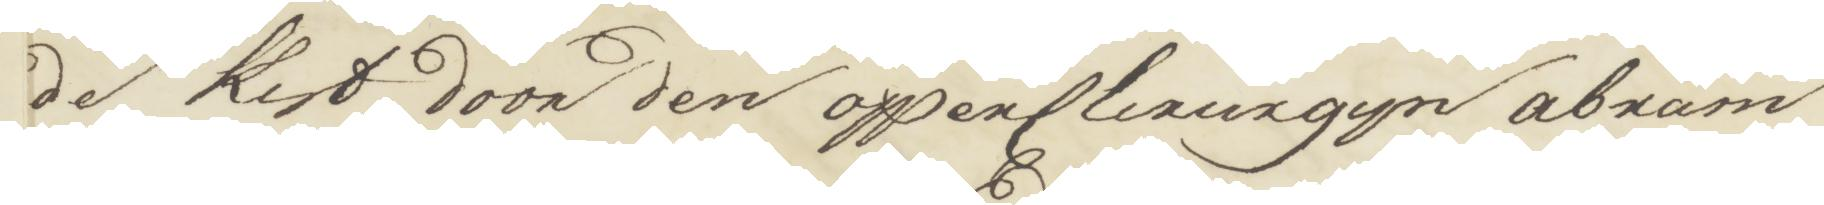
de kist door den opperchirurgyn abram
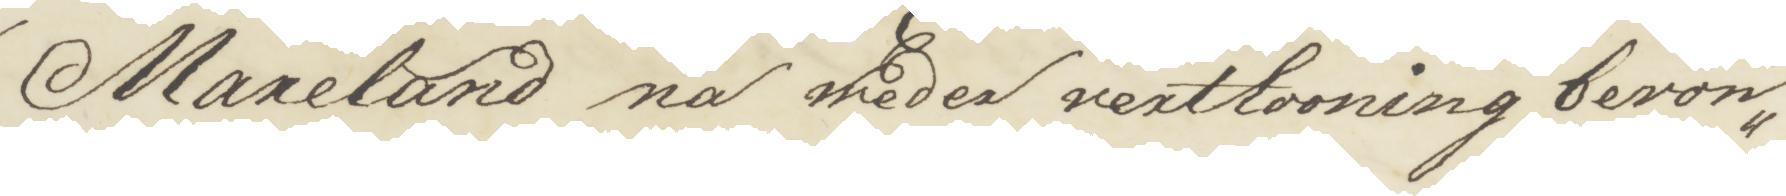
Mareland na weder verthooning bevon„
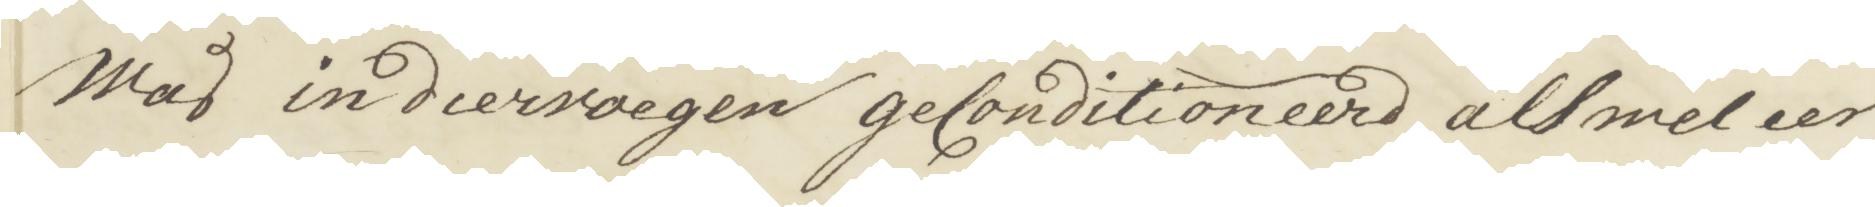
was in dier voegen geconditioneerd als wel eer
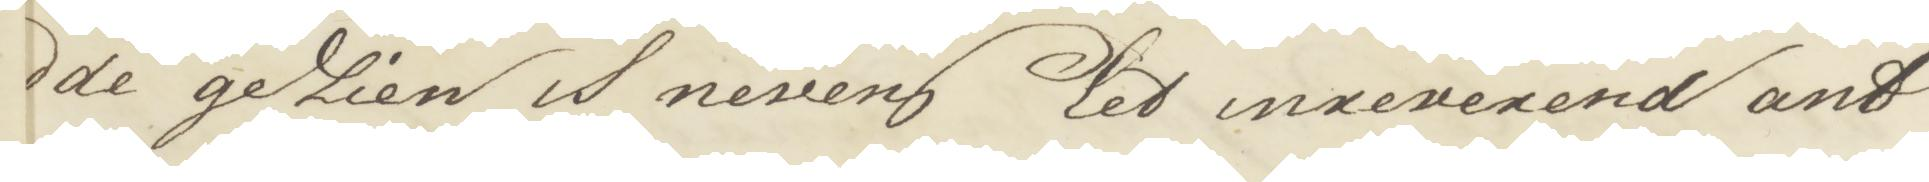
dde gezien is nevens het inreverend ant
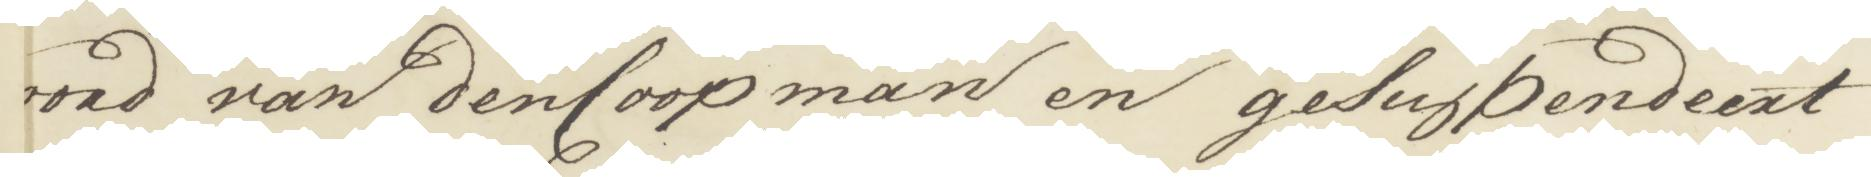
oord van den Coopman en gesuspendeert
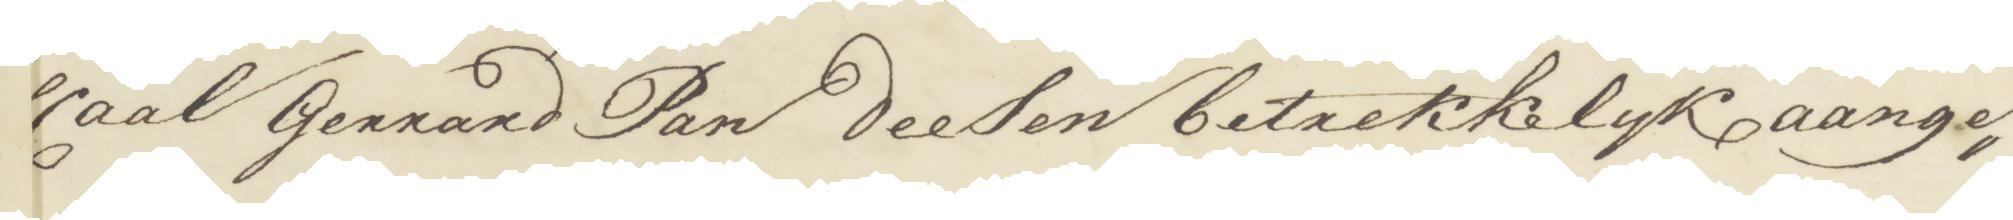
aal Gerrard Pan deesen betrekkelyk aange„
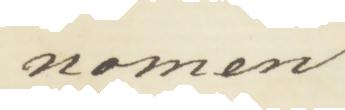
nomen
